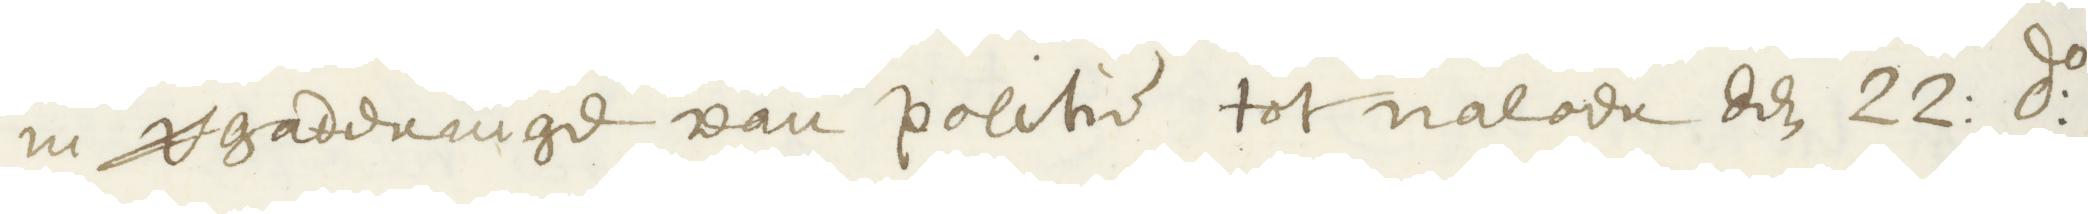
in vergaderinge van politie tot naloer den 22: d:o
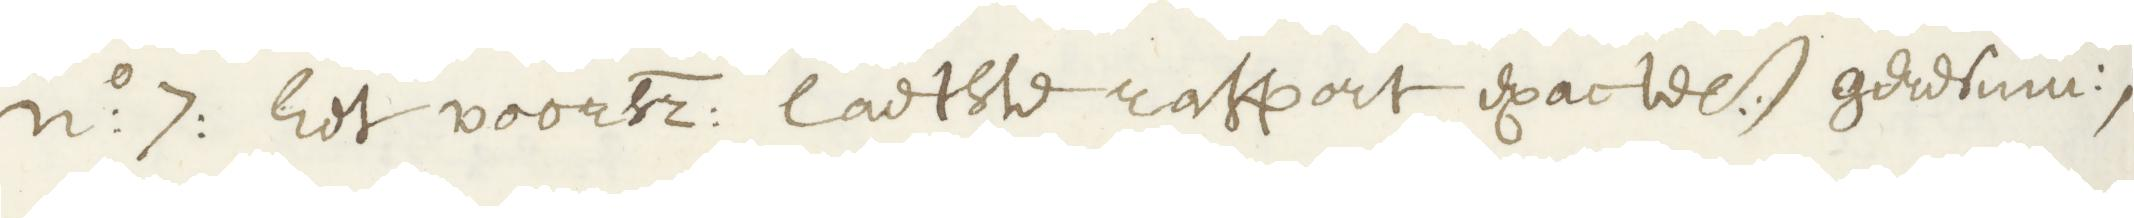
n:o 7: het voorsz: laetste rapport exactelijk geresum:,
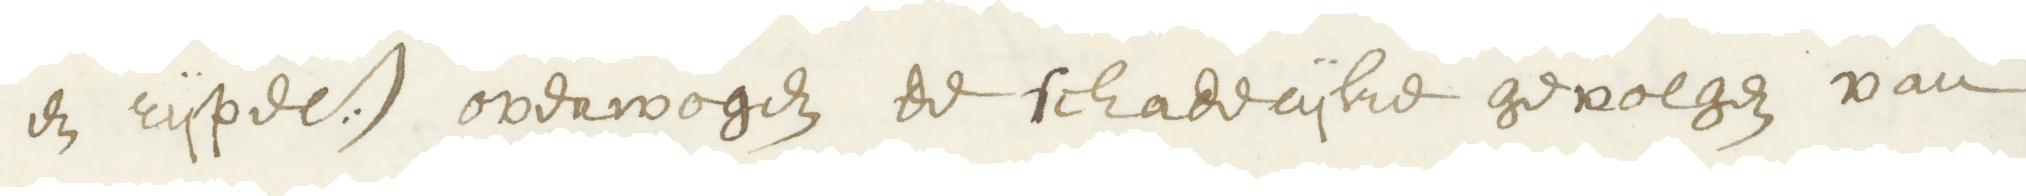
en rijpelijk overwogen de schadelijke gevolgen van
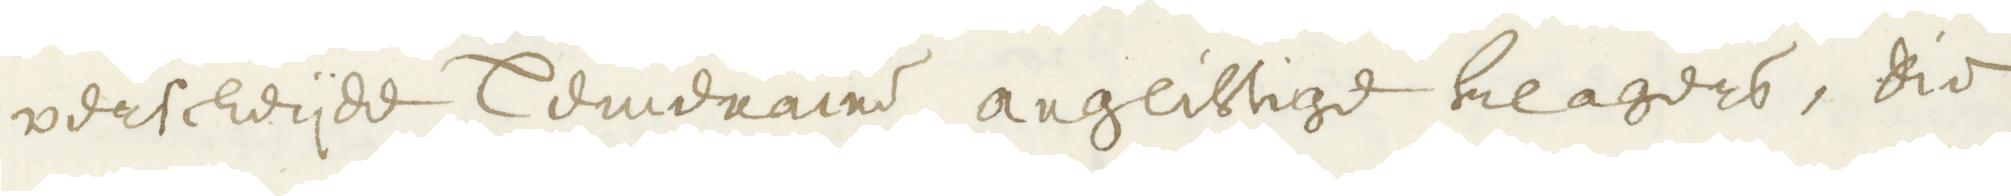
verscheijde Temeraire arglistige klagers, die
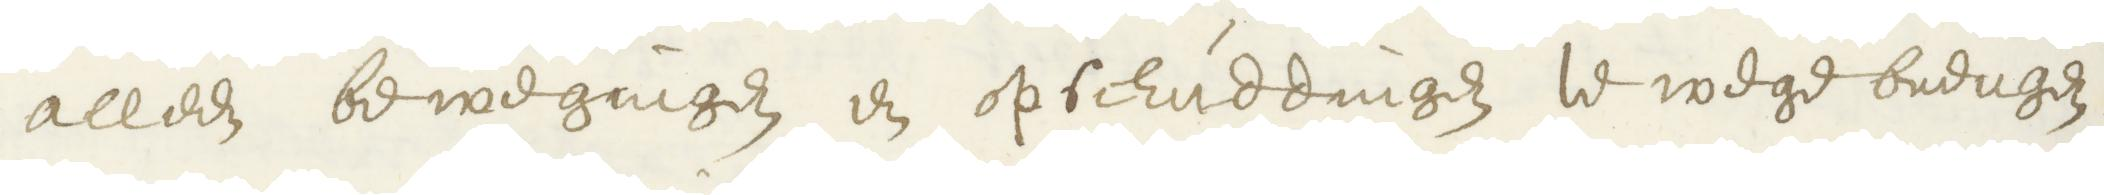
alleen bewegingen en opschuddingen te wege brengen
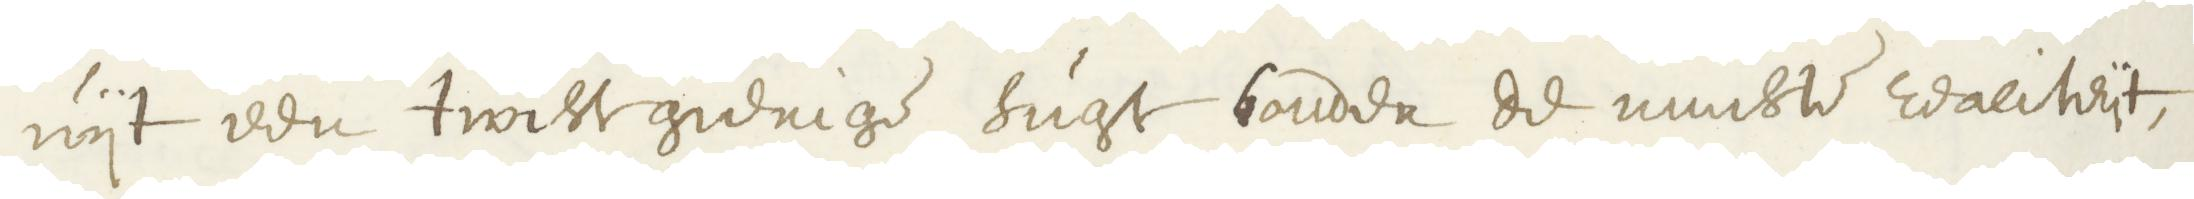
uijt een twistgierige sugt sonder de minste realiteijt,
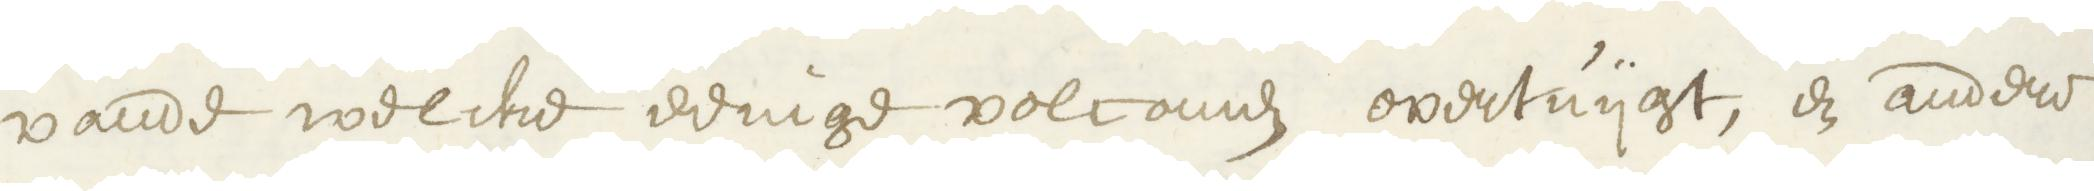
vande welcke eenige volcomen overtuijgt, en andere
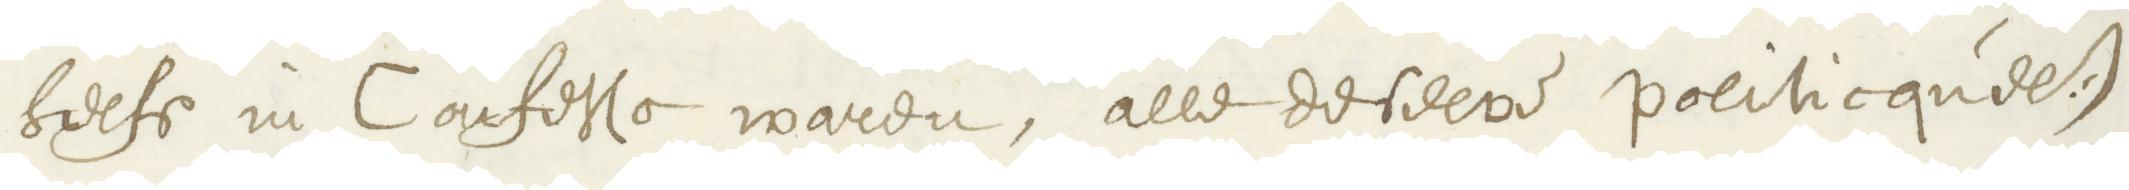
selfs in Confesse waren, alle deselve politicquelijk
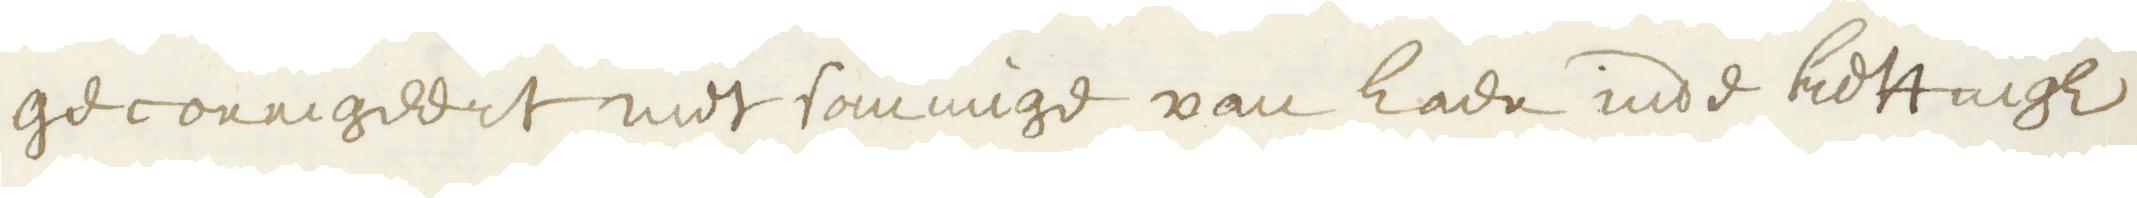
gecorrigeert met sommige van haer inde kettingh
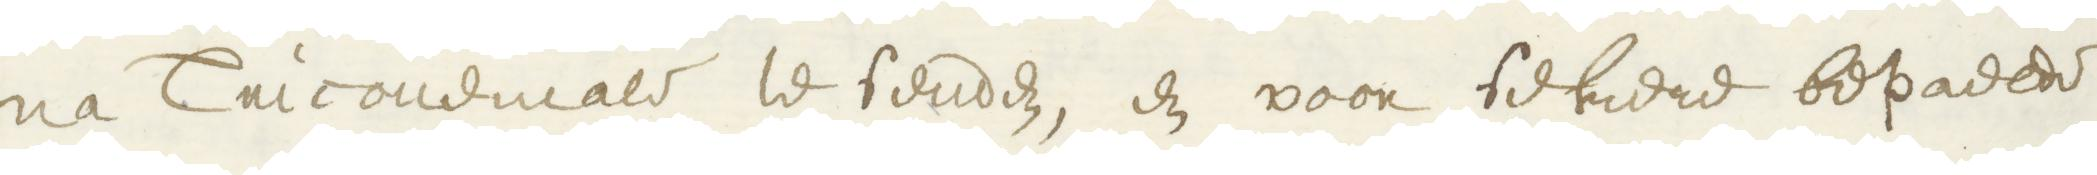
na Triconemale te senden, en voor sekere bepaelde
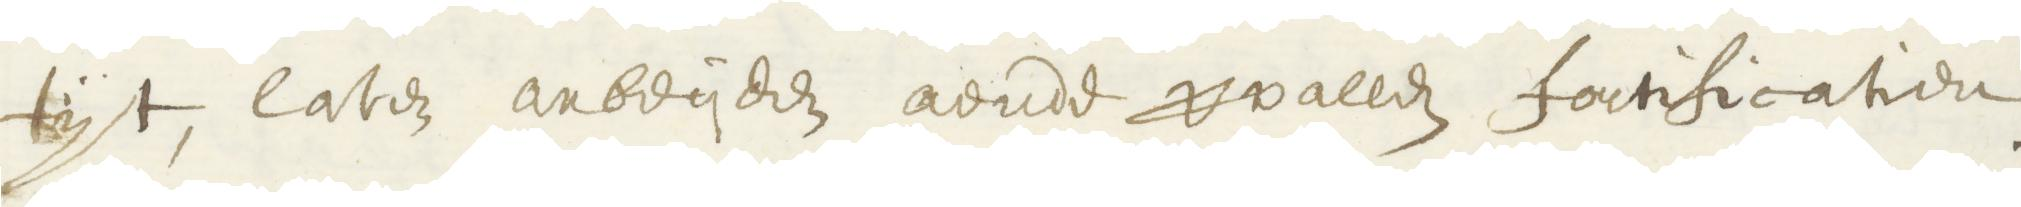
tijt, laten arbeijden aende vervallen fortificatien
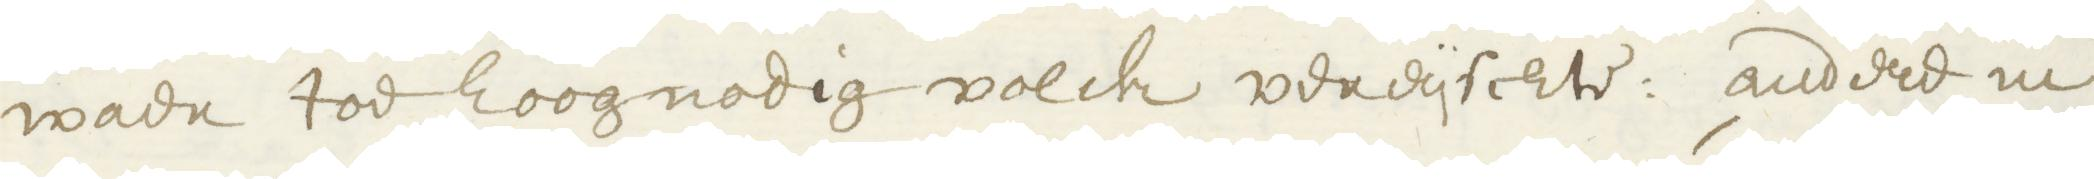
waer toe hoognodig volck vereijschte: andere in
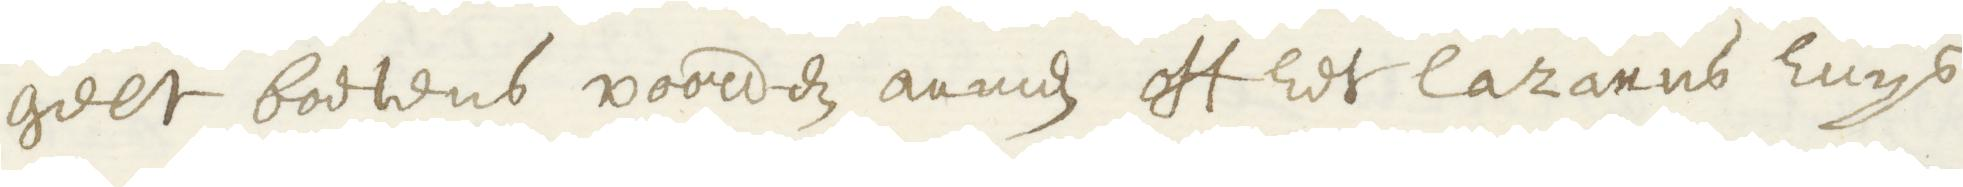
gelt boetens voorden armen off het lazarus huijs
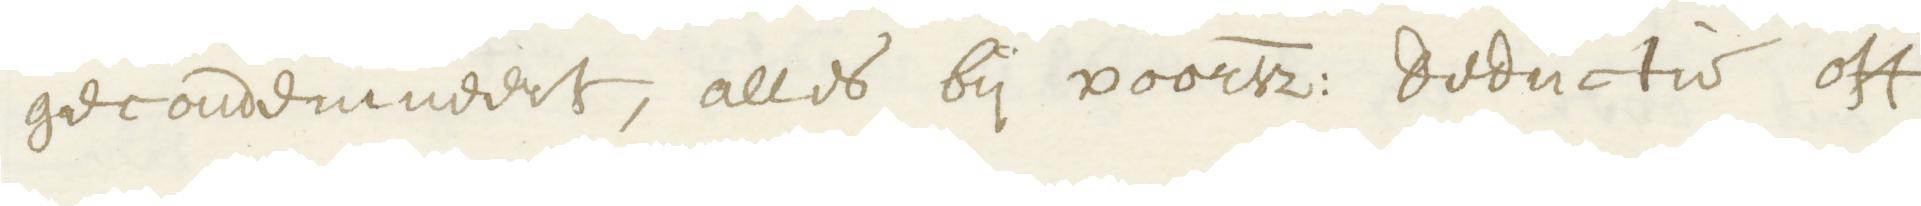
gecondemneert, alles bij voorsz: deductie off
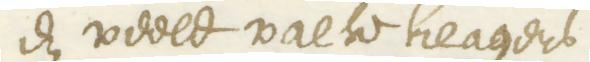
en veele valse klagers
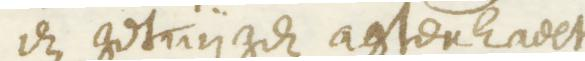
en getuijgen agterhaelt
